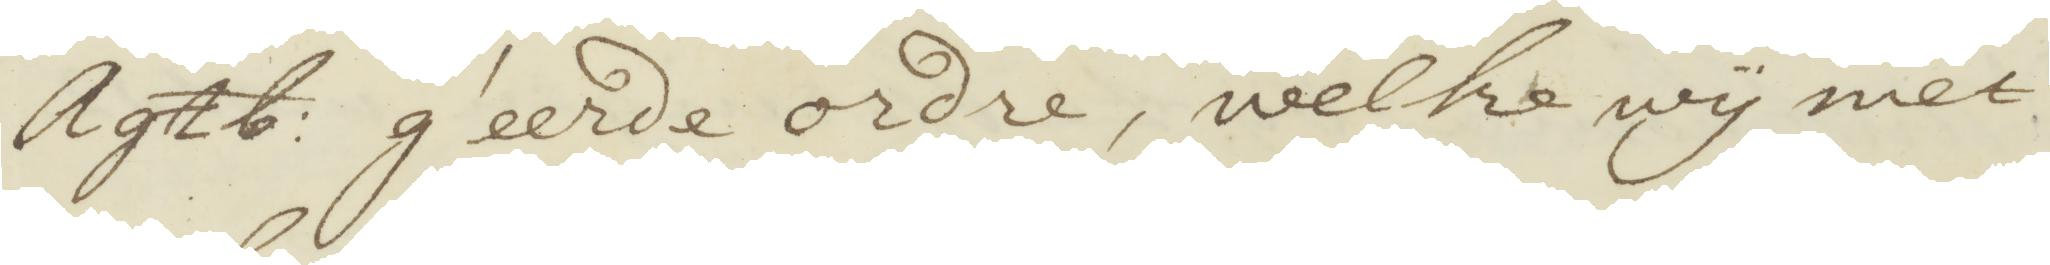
Agtb: g’eerde ordre, welke wij met
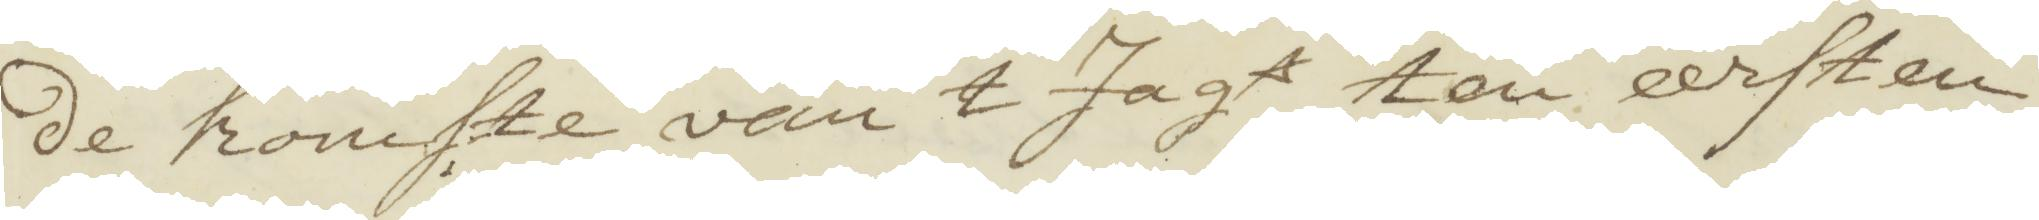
de komste van ’t Jagt ten eersten
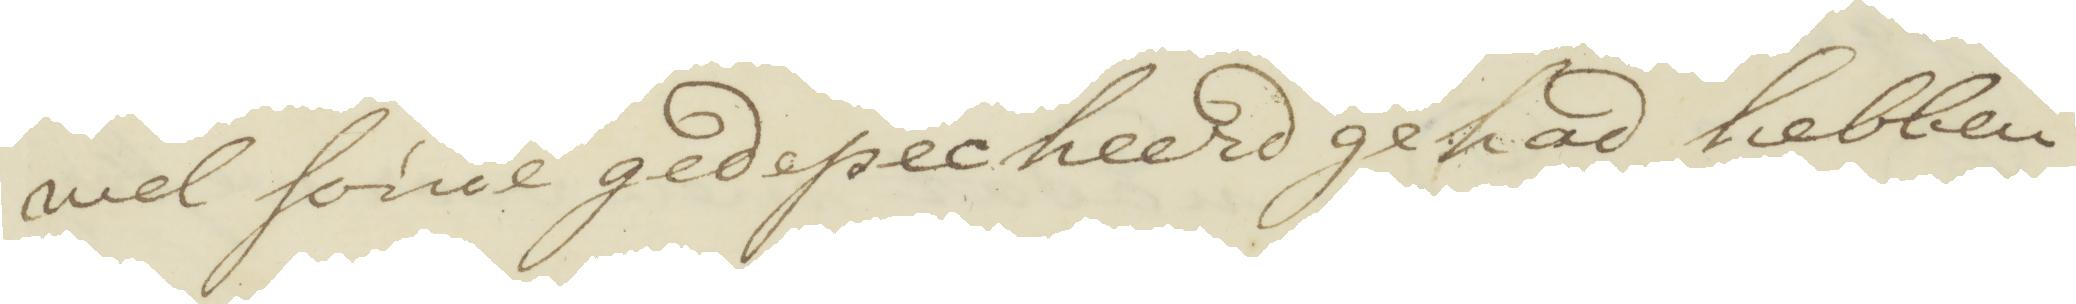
wel soude gedepecheerd gehad hebben
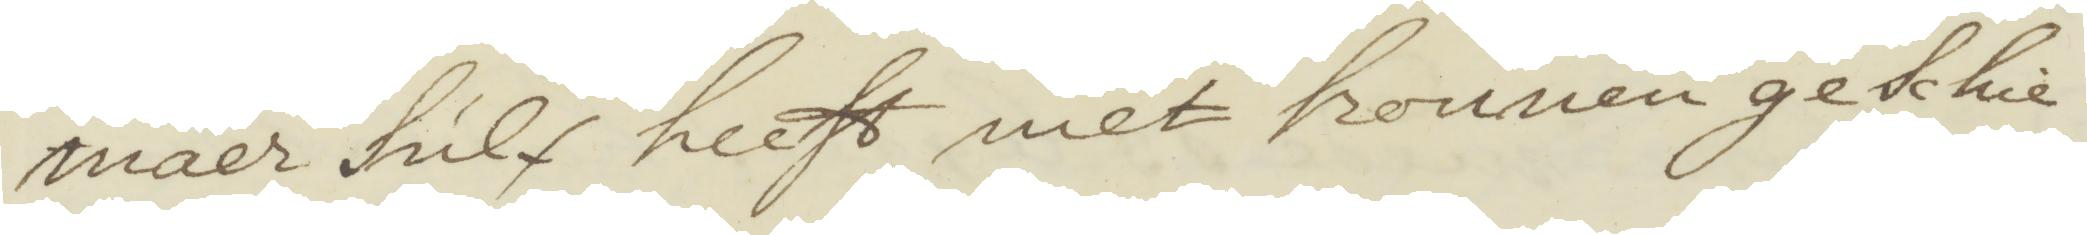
maer sulx heeft niet konnen geschie
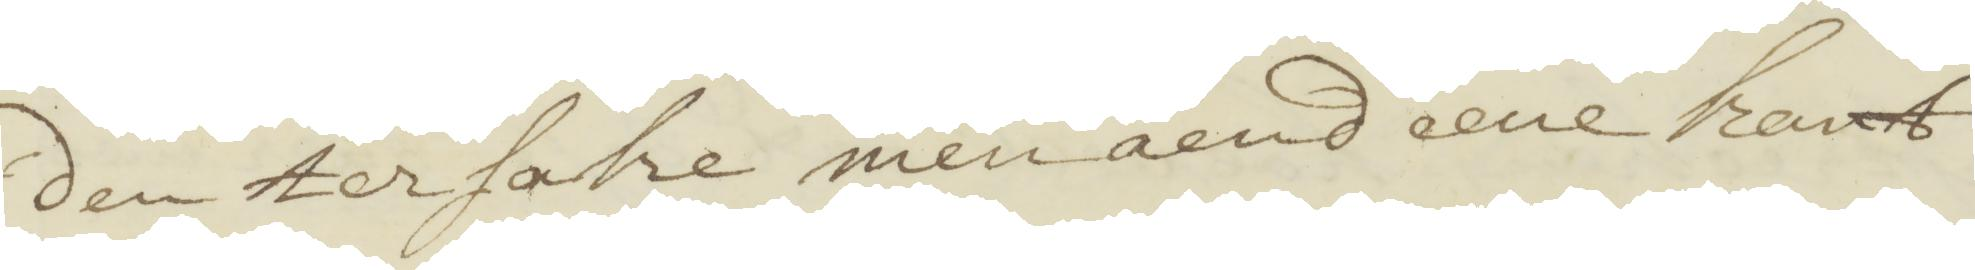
den tersake men aend'eene kant
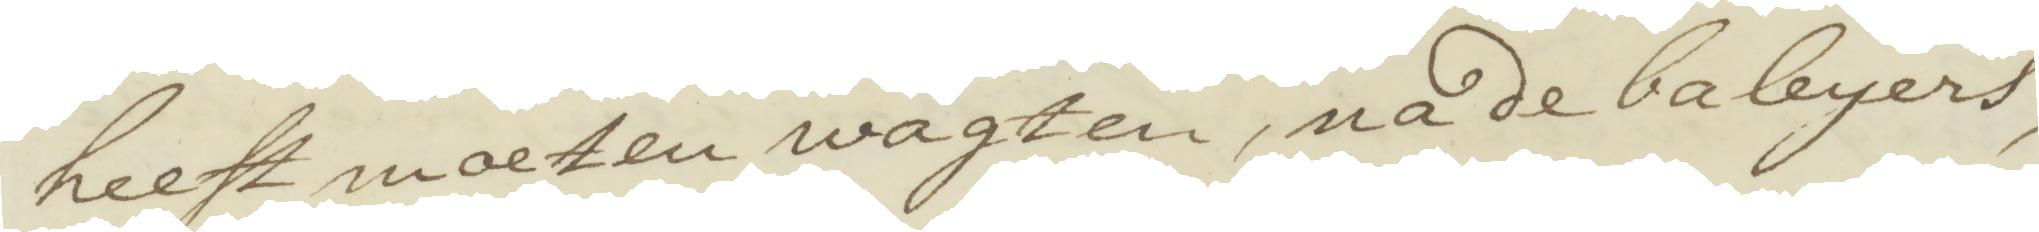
heeft moeten wagten, na de baleyers,
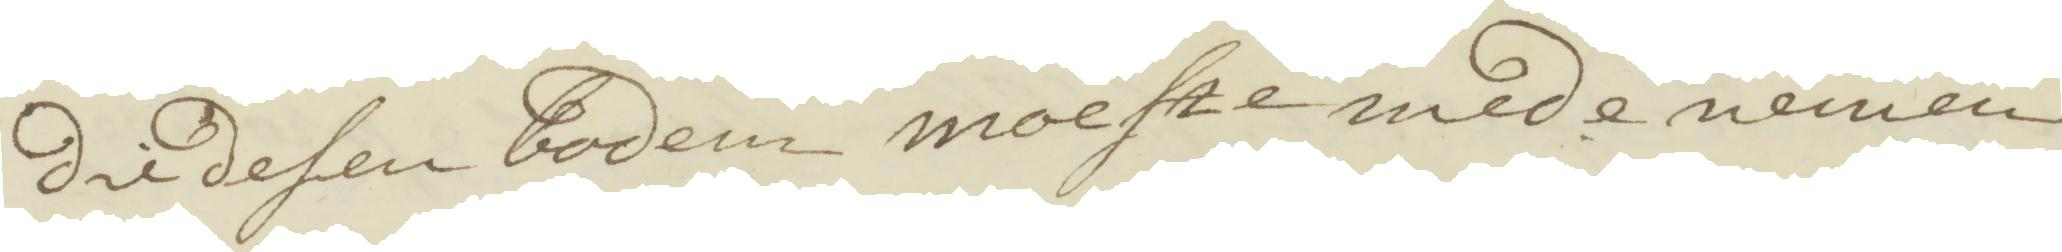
die desen bodem moeste mede nemen
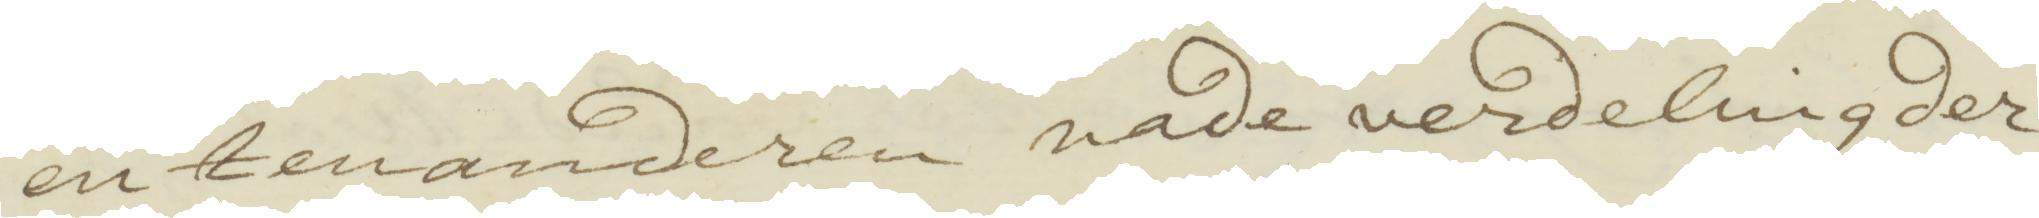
en ten anderen nade verdeling der
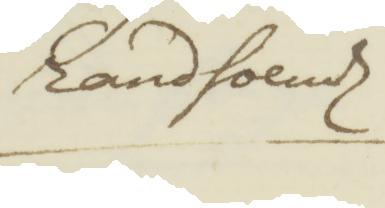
randsoenden
